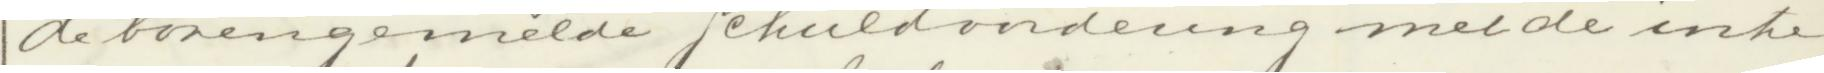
de bovengemelde schuldvordering met de inte
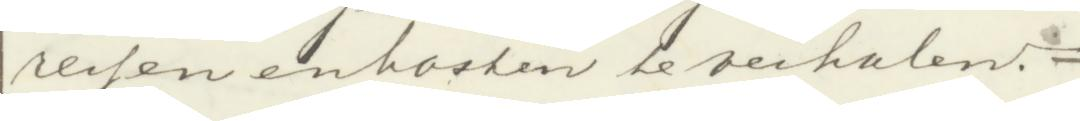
ressen en kosten te verhalen.-
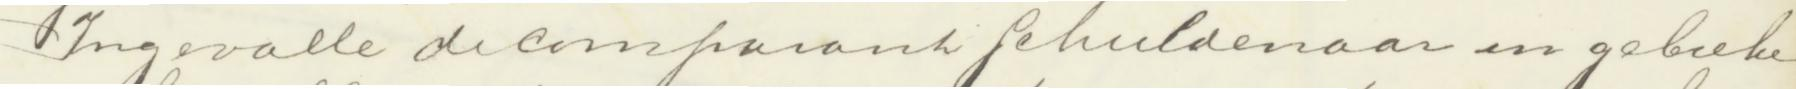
Jngevalle de comparant schuldenaar in gebreke
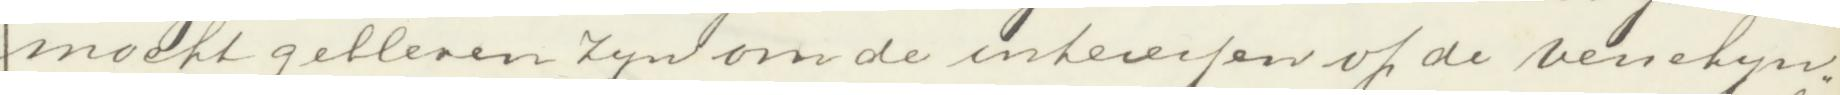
mocht gebleven zyn om de interessen op de verschyn„
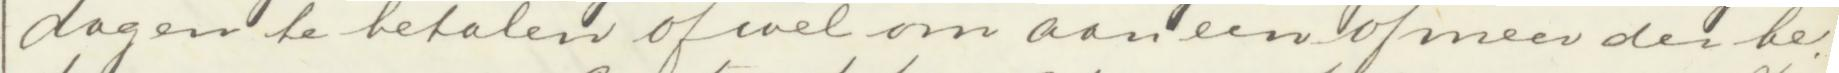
dagen te betalen of wel om aan een of meer der be,
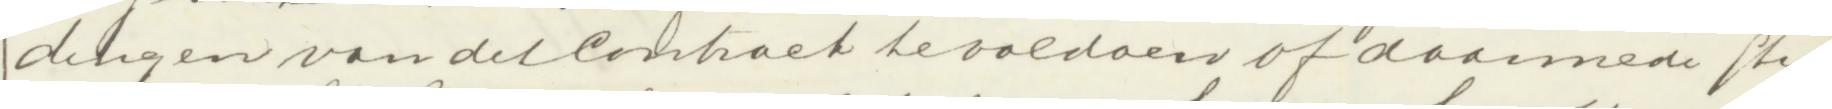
dingen van dit Contract te voldoen of daarmede stry
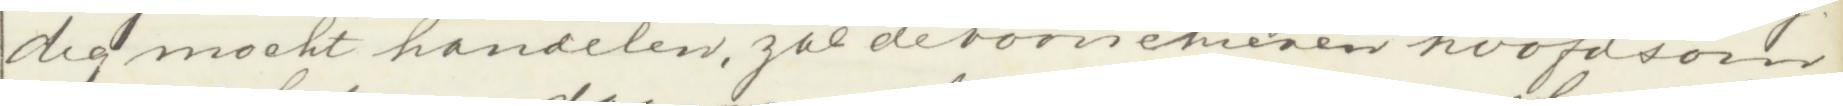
dig mocht handelen, zal de voorschreven hoofdsom
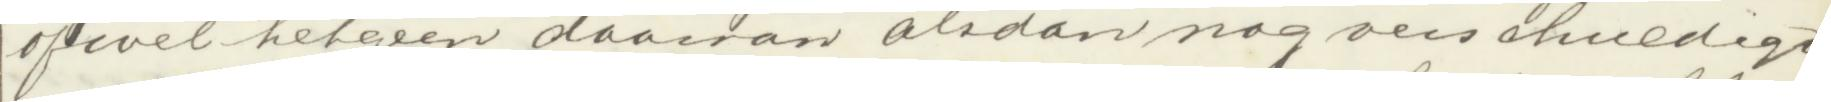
ofwel hetgeen daarvan alsdan nog verschuldigd
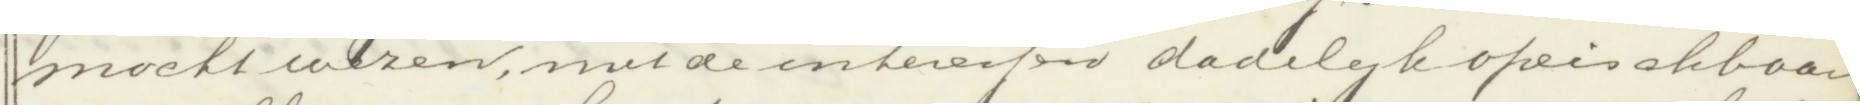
mocht wezen, met de interessen dadelyk opeischbaar
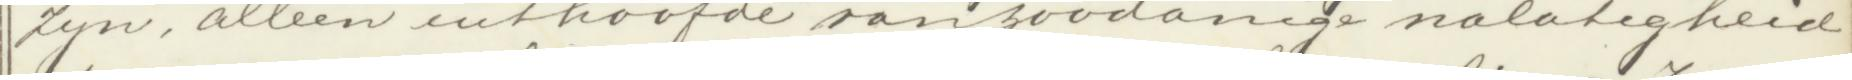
zyn, alleen uithoofde van zoodanige nalatigheid
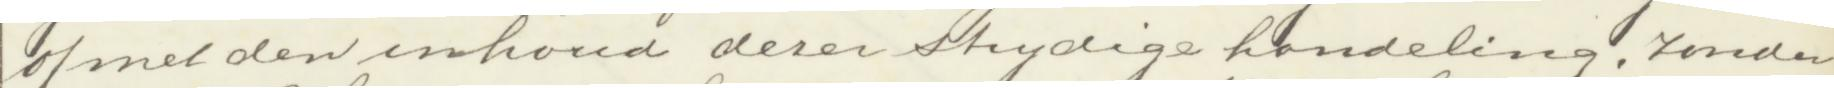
of met den inhoud dezer strydige handeling, zonder
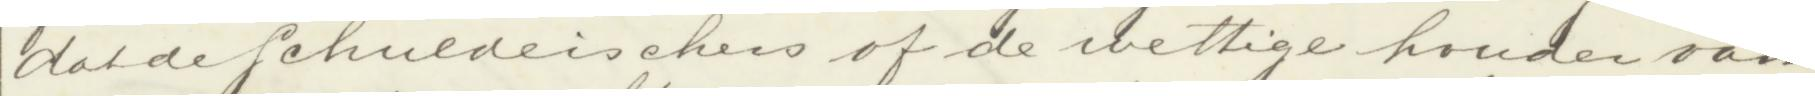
dat de schuldeischers of de wettige houder van
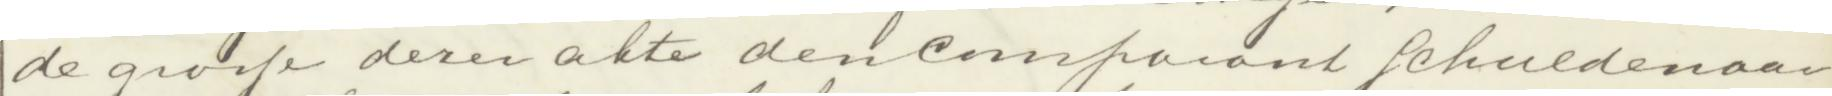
de grosse dezer akte den comparant schuldenaar
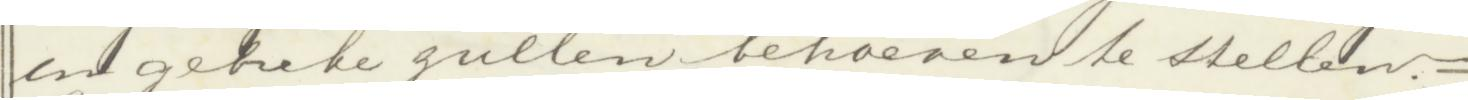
in gebreke zullen behoeven te stellen.-
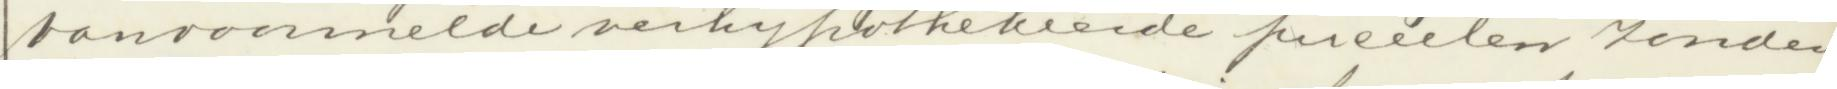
van voormelde verhypothekeerde perceelen zonder
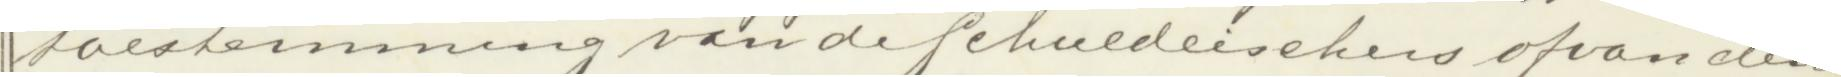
toestemming van de schuldeischers of van den
